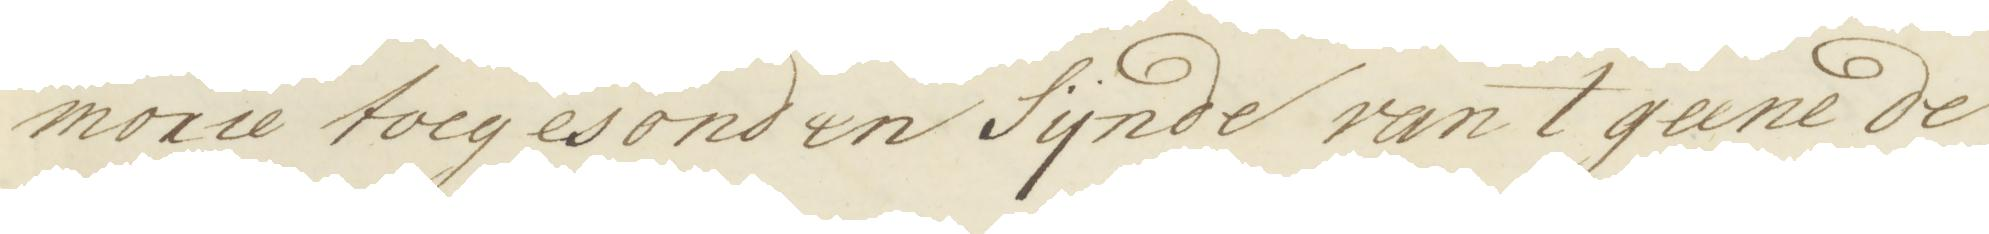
morie toegesonden sijnde van t geene de
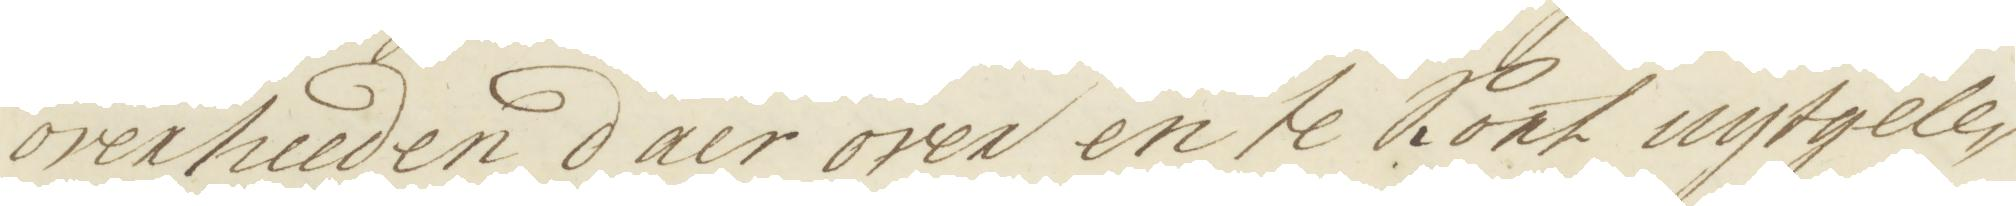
overheeden daer over en te kort uytgele
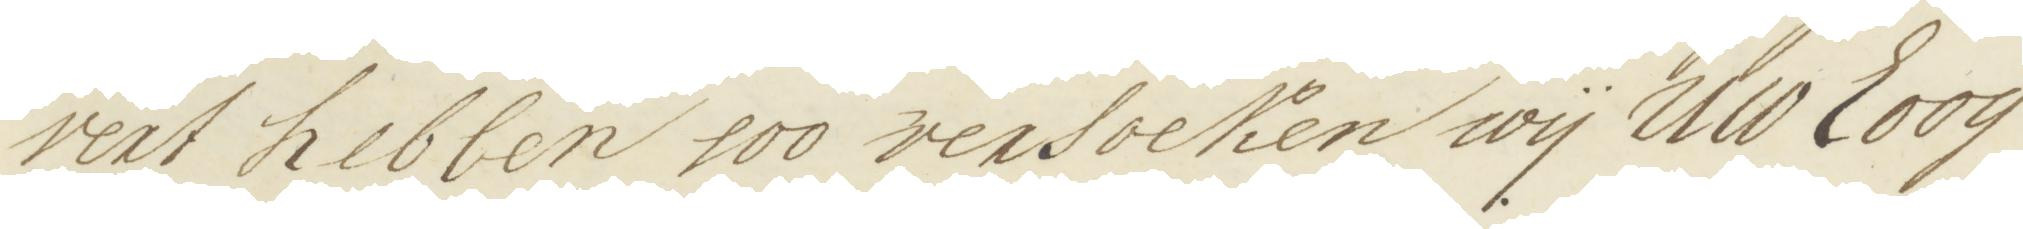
vert hebben soo versoeken wij uw hoog
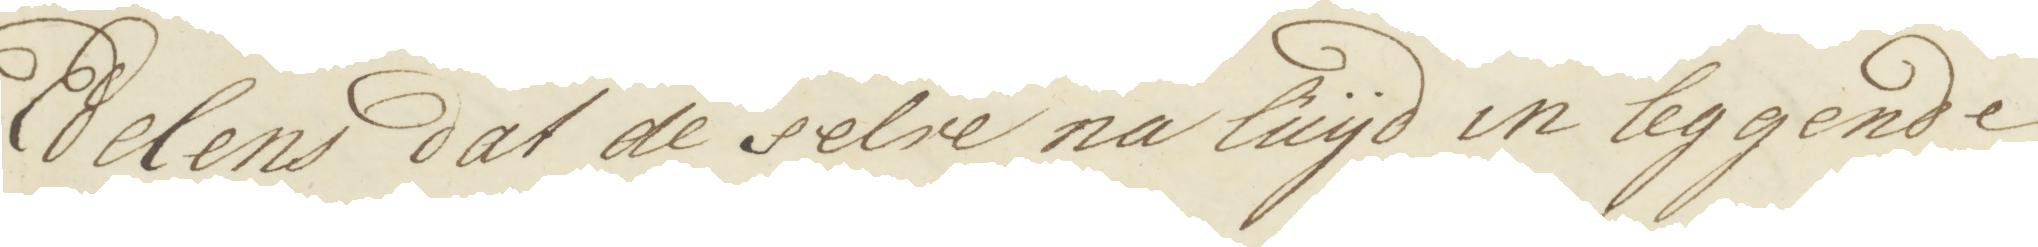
Edelens dat de selve na luijd in leggende
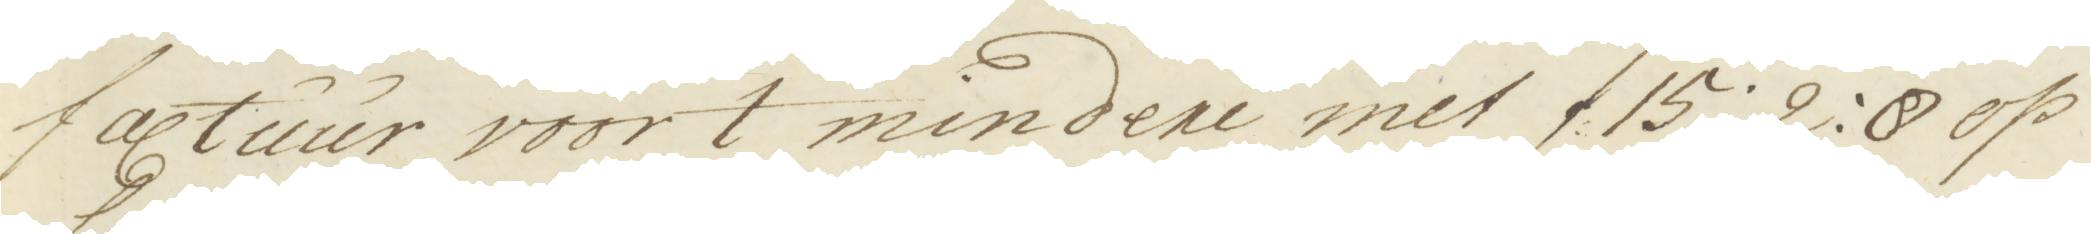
factuur voor t mindere met ƒ15:2:8 op
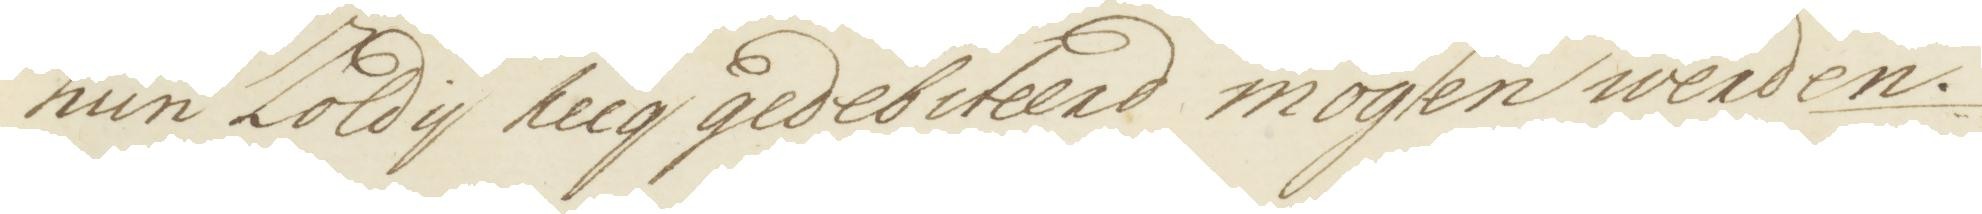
hun zoldij reeq gedebiteerd mogen werden.
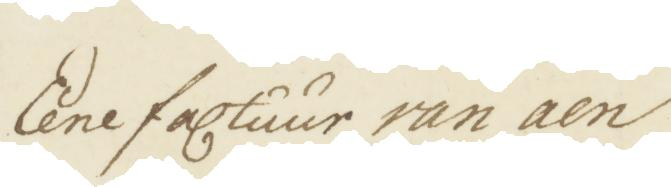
Eene factuur van aen
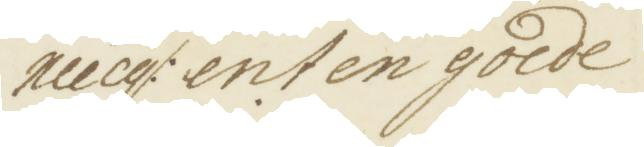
reecq: en ten goede
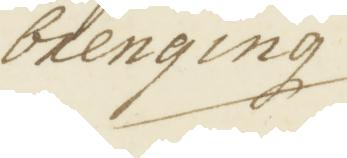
brenging
